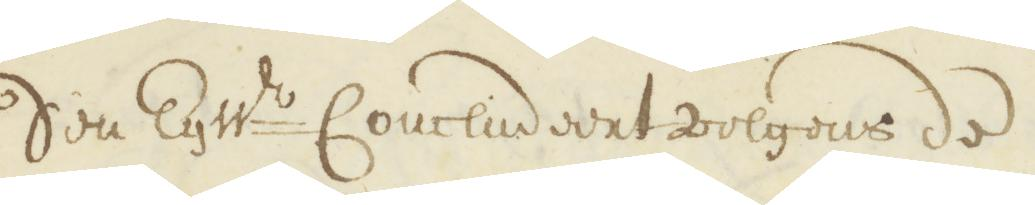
den Eyss=er Concludeert volgens de
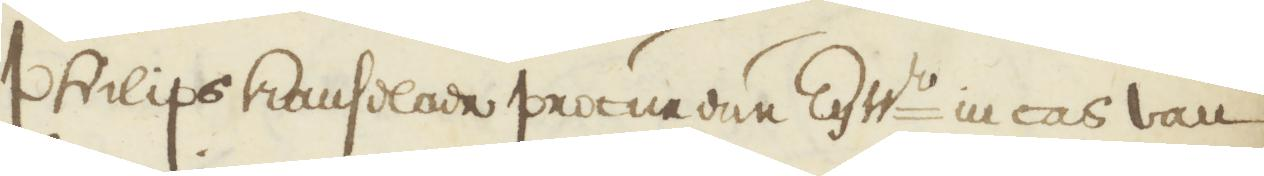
Philips kanselaer procureur Eyss=r in cas van
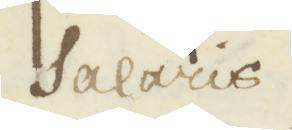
salaris
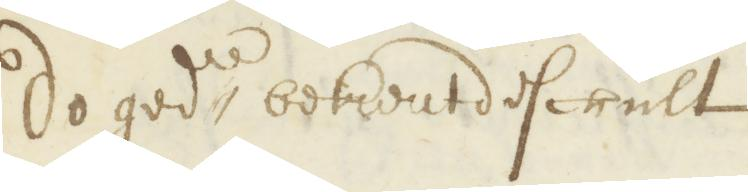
do ged„e bekent deschult
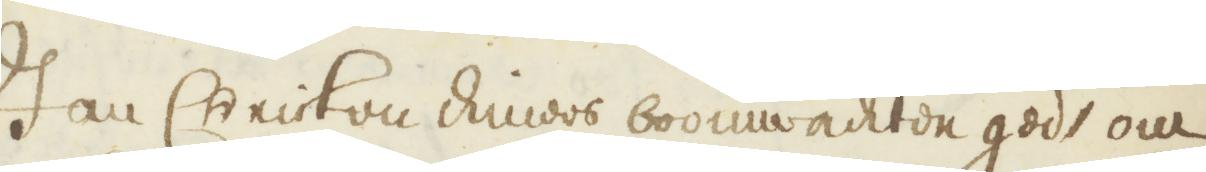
Ian Christen chinees boomwachter ged/ om
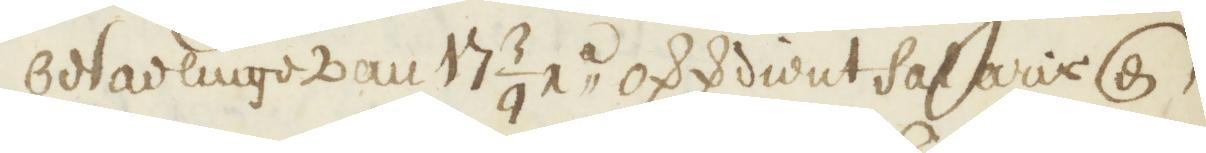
betaelinge van 17 ¾ r„a over verdient salaris ende
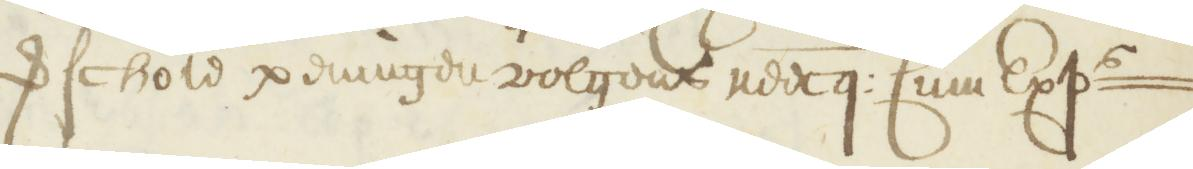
verschote peningen volgens reecq: Cum Exp=s
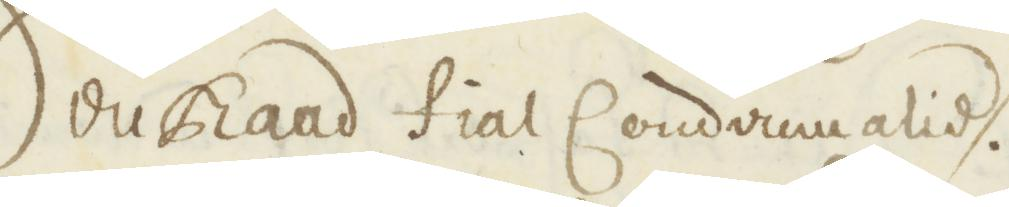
Den Raad fiat Condemnatie/.
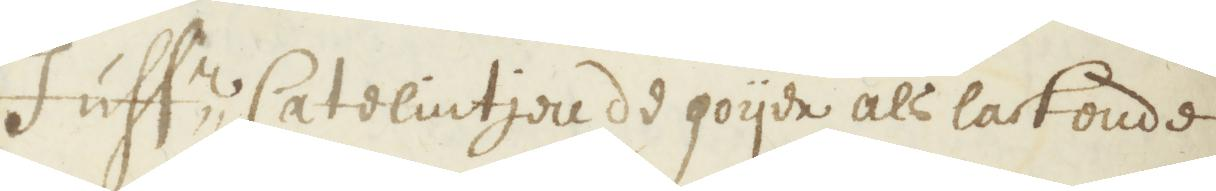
Iuff„r Catelintjen de goijer als lastende
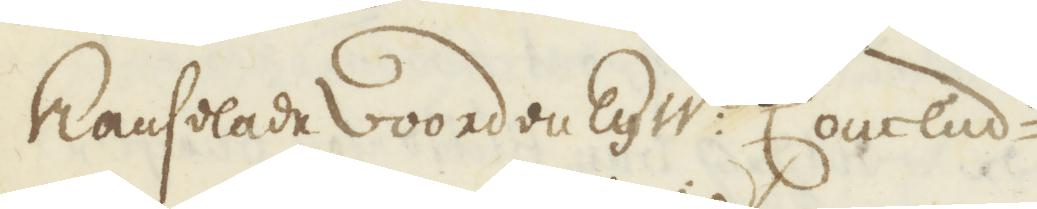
kanselaer voorden Eyss:rce Conclud=t
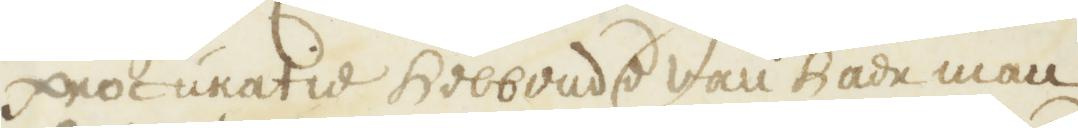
procuratie hebbende van haer man
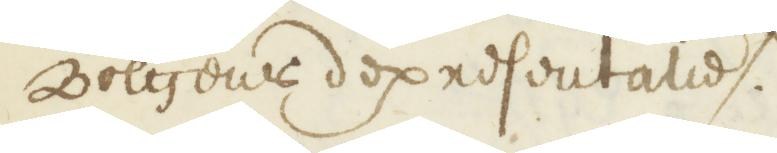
volgens depresentatie/.
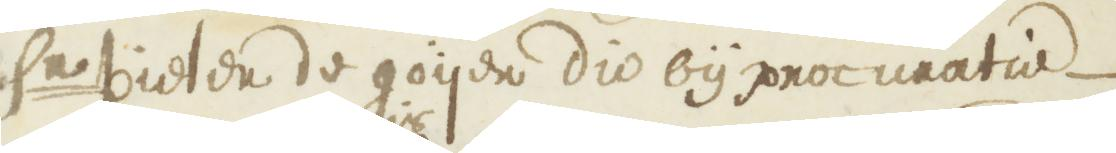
s=r Pieter de goijer die bij procuratie —
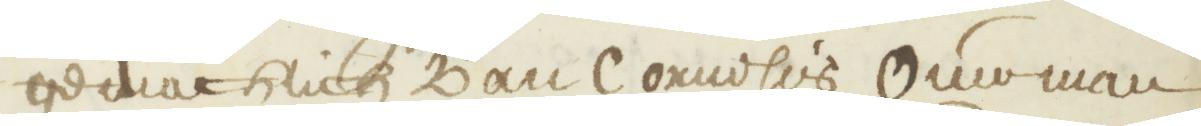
gemachtich is van Cornelis Ouwman
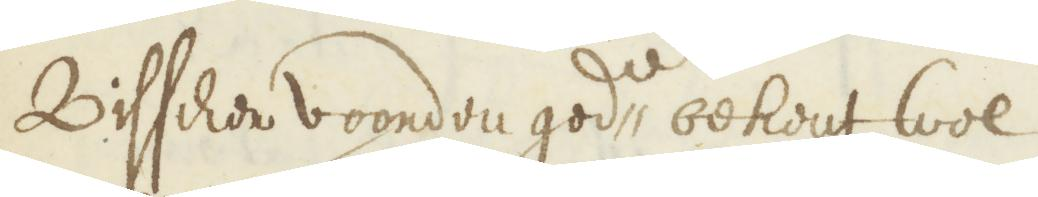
Visscher voorden ged„e bekent wel
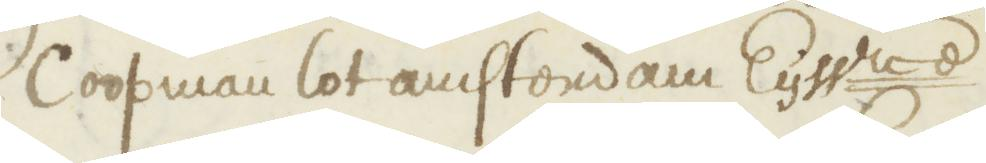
Coopman tot amsterdam Eijss=rce
